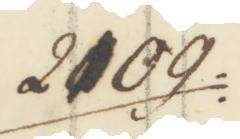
2409:
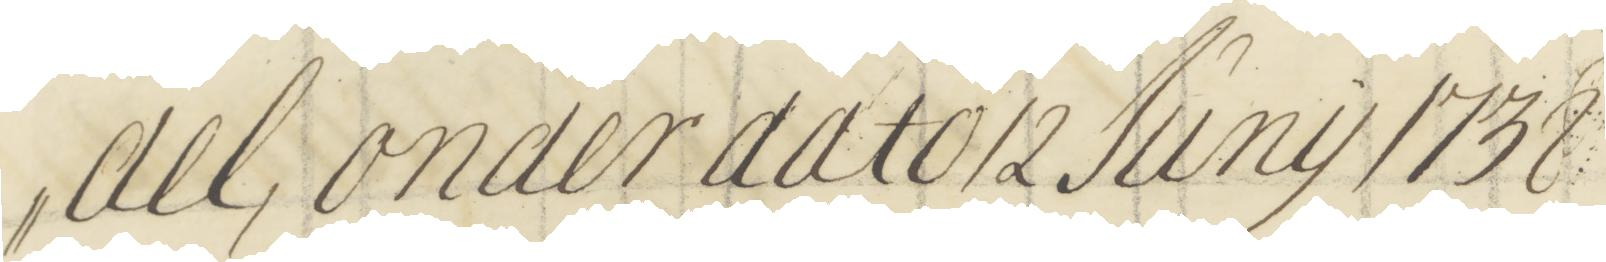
„del, onder dato 12 Iunij 1738:
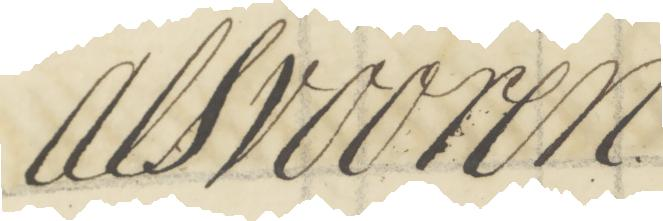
alsvooren.
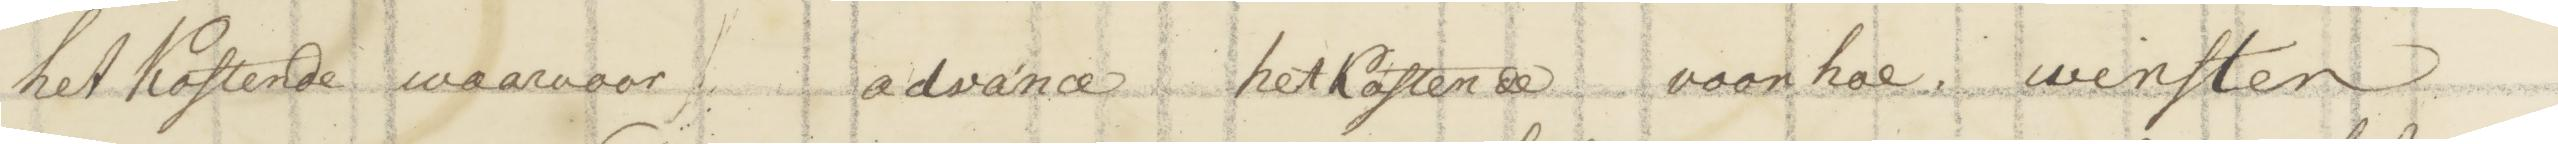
het kostende waarvoor advance het kostende voor hoe winsten
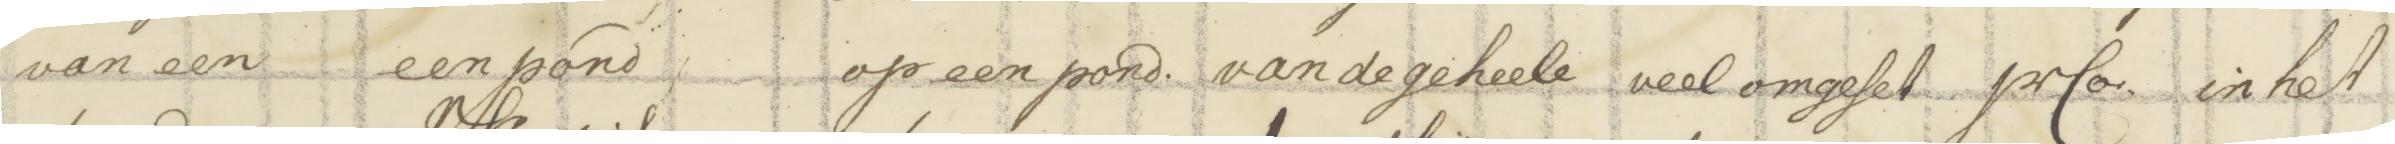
van een een pond op een pond. van de geheele veel omgeset prCo. in het
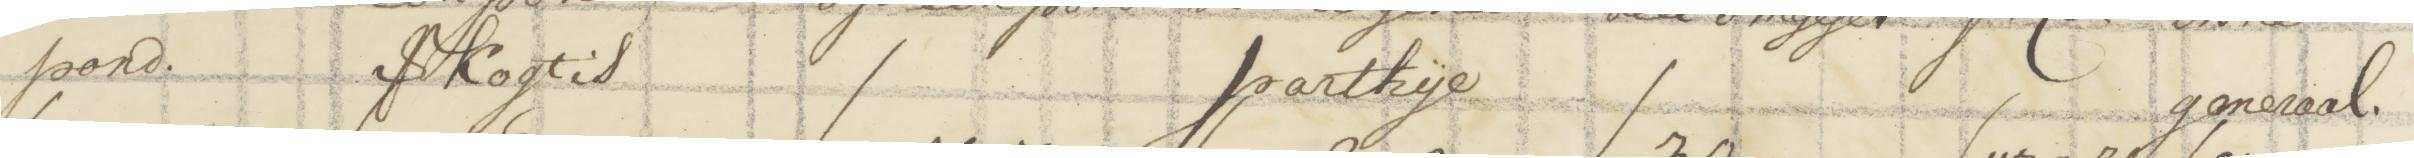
pond. verkogt is parthije generaal.
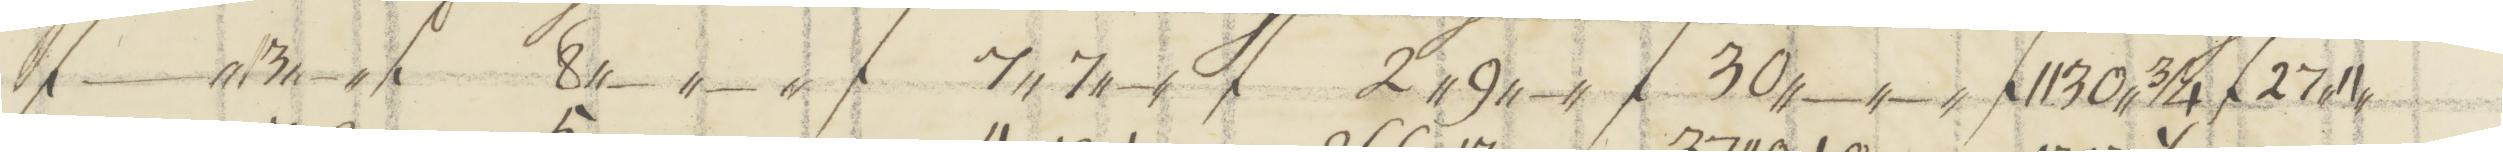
ƒ —„ 3„ —„ ƒ 8„ —„ —„ ƒ 7„ 7„— „ ƒ 2„ 9„ —„ ƒ 30„ —„ —„ ƒ 1130„ 3/4 ƒ 27„ 11„
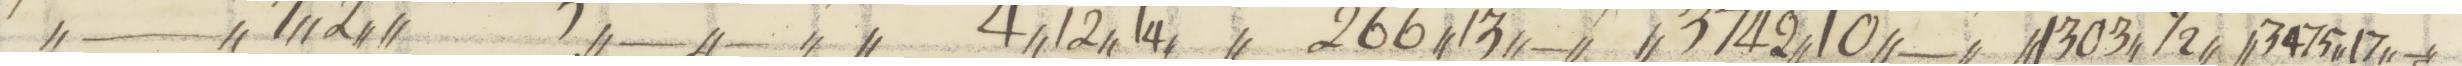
„ —„ 7„ 2„ „ 5„ —„ —„ „ 4„ 12„ 14„ „ 266„ 13„ —„ „ 3742„ 10„ —„ „ 1303„ ½„ „ 3475„ 17„ —„
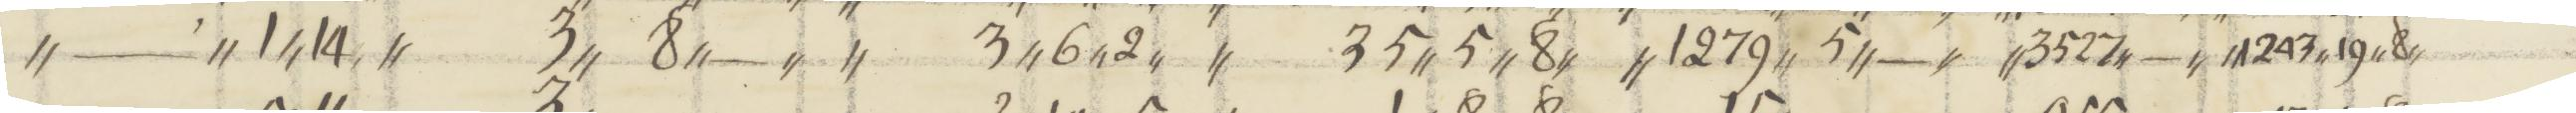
„ —„ 1„ 14„ „ 3„ 8„ —„ „ 3„ 6„ 2„ „ 35„ 5„ 8„ „ 1279„ 5„ —„ „ 3527„ —„ „ 1243„ 19„ 8„
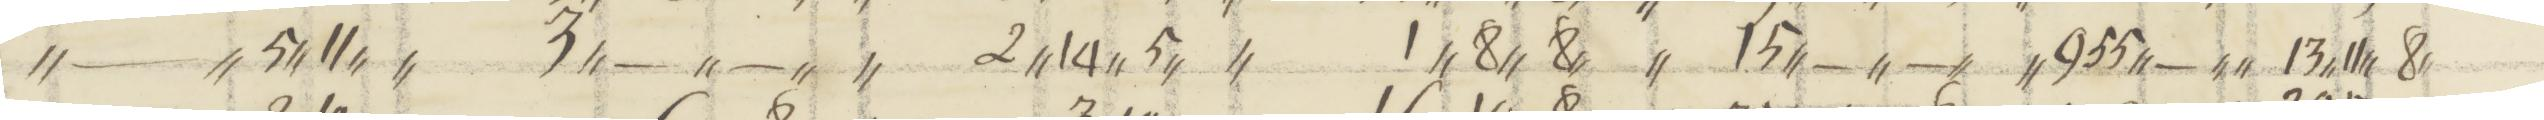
„ —„ 5„ 11„ „ 3„ —„ —„ „ 2„ 14„ 5„ „ 1„ 8„ 8„ „ 15„ —„ —„ „ 955„ —„ „ 13„ 11„ 8„
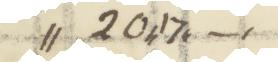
„ 20„ 17„ —,
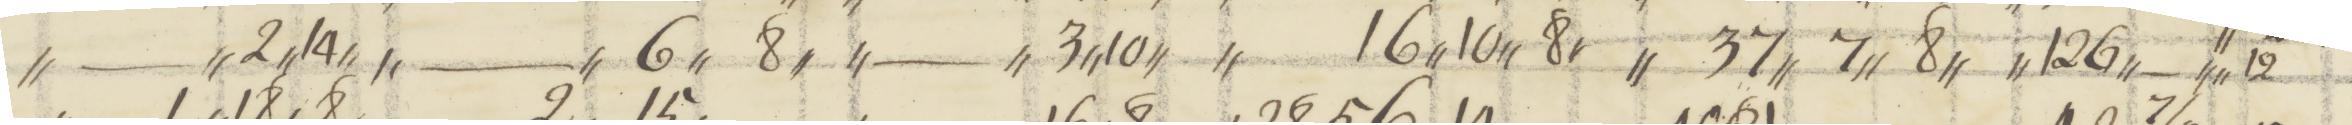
„ —„ 2„ 14„ „ —„ 6„ 8„ „ —„ 3„ 10„ „ 16„ 10„ 8„ „ 37„ 7„ 8„ „ 126„ —„ „ 12
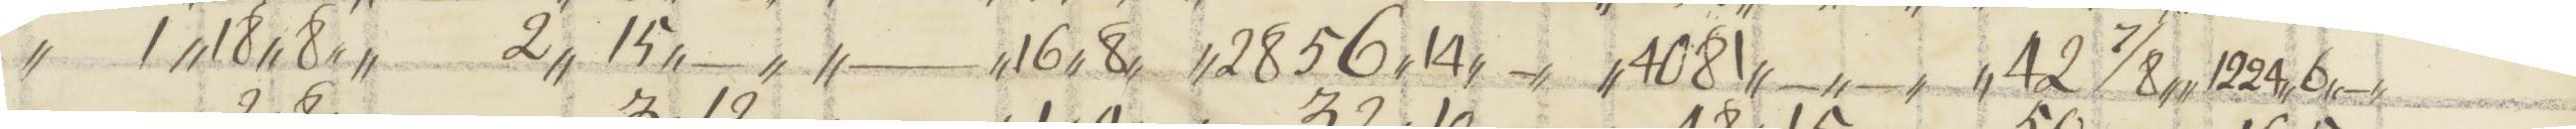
„ 1„ 18„ 8„ „ 2„ 15„ —„ „ —„ 16„ 8„ „ 2856„ 14„ —„ „ 4081„ —„ —„ „ 42 7/8„ „ 1224„ 6„ —„
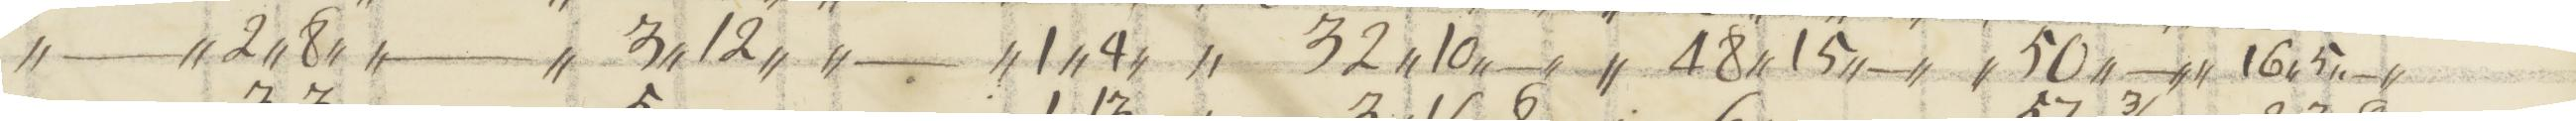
„ —„ 2„ 8„ „ —„ 3„ 12„ „ —„ 1„ 4„ „ 32„ 10„ —„ „ 48„ 15„ —„ „ 50„ —„ „ 16„ 5„ —„
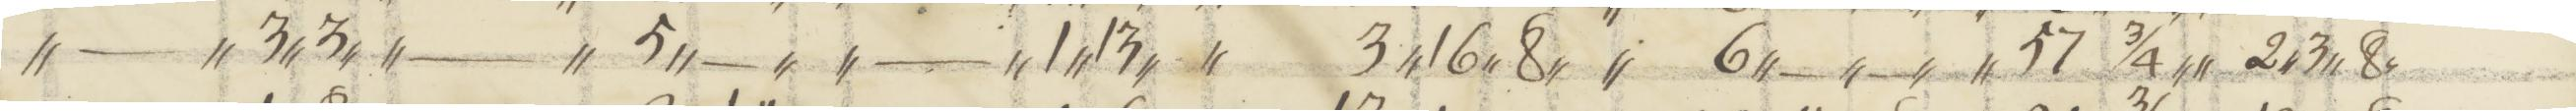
„ —„ 3„ 3„ „ —„ 5„ —„ „ —„ 1„ 13„ „ 3„ 16„ 8„ „ 6„ —„ —„ „ 57 3/4„ „ 2„ 3„ 8„
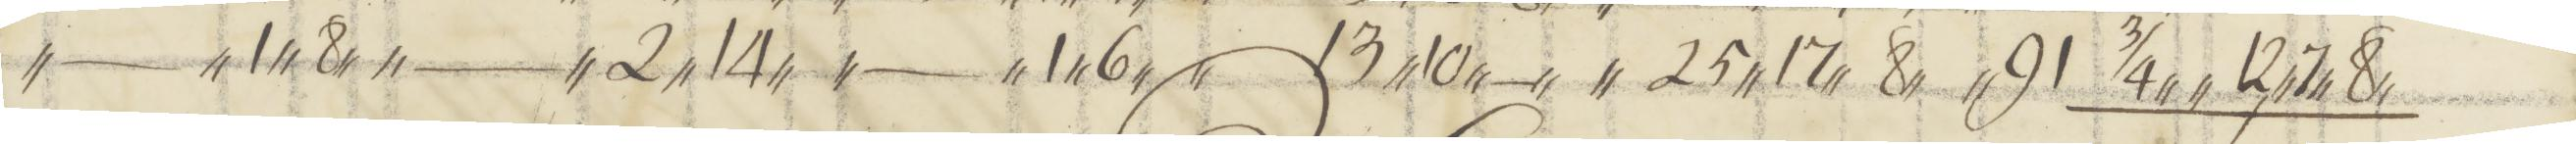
„ —„ 1„ 8„ „ —„ 2„ 14„ „ —„ 1„ 6„ „ 13„ 10„ —„ „ 25„ 17„ 8„ „ 91 3/4„ „ 12„ 7„ 8„
